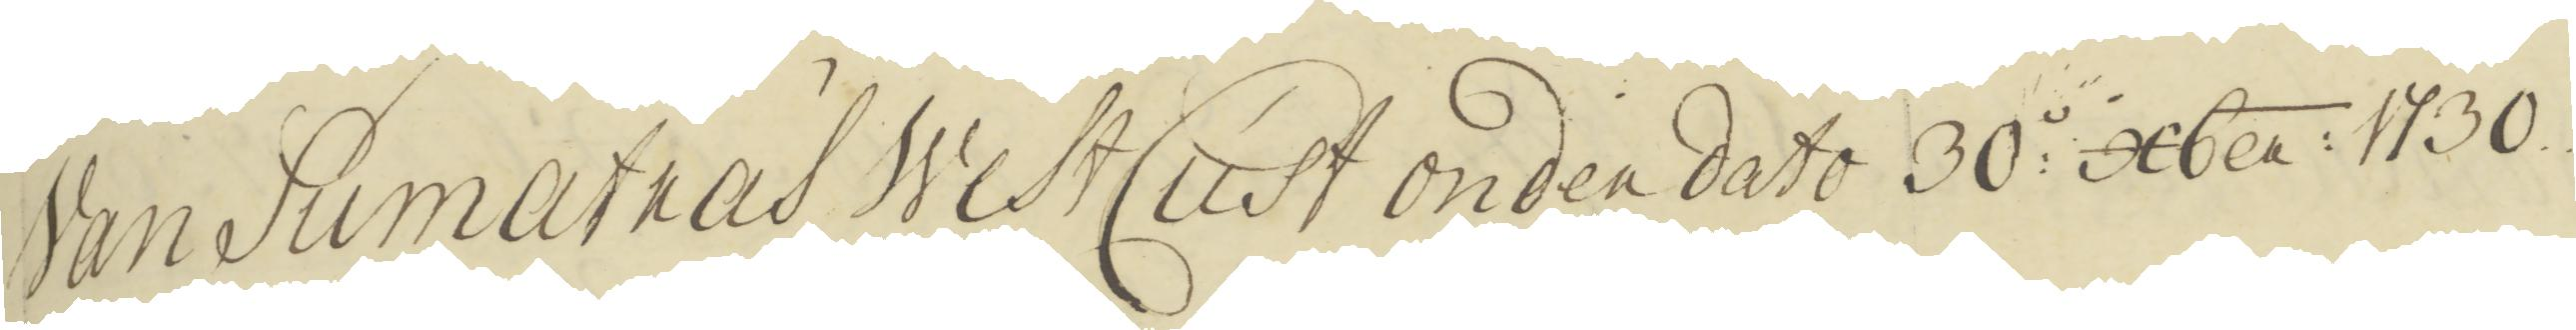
Van Sumatra's West Cust onder dato 30:e xber: 1730.
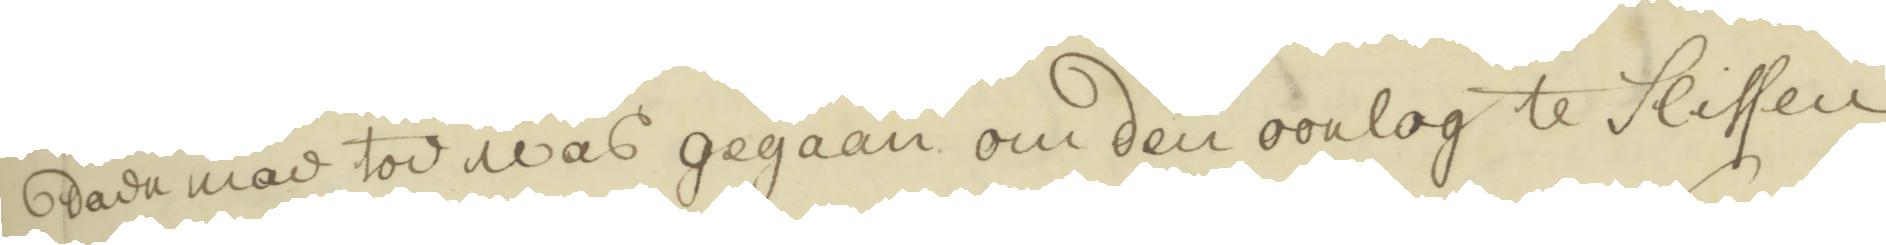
daer mae toe was gegaan om den oorlog te slissen
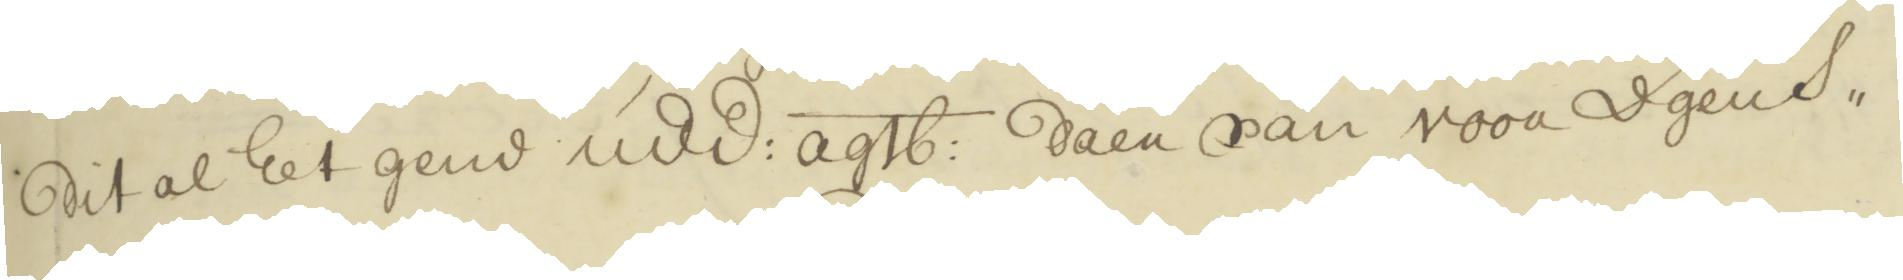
dit al het gene uEE: agtb: daer van voor tegens„
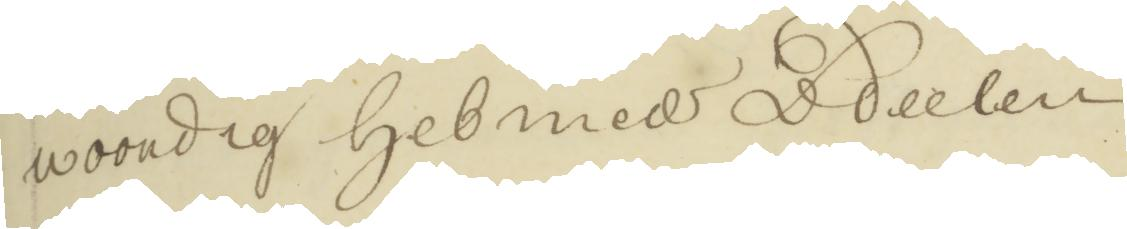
woordig heb mede tedeelen
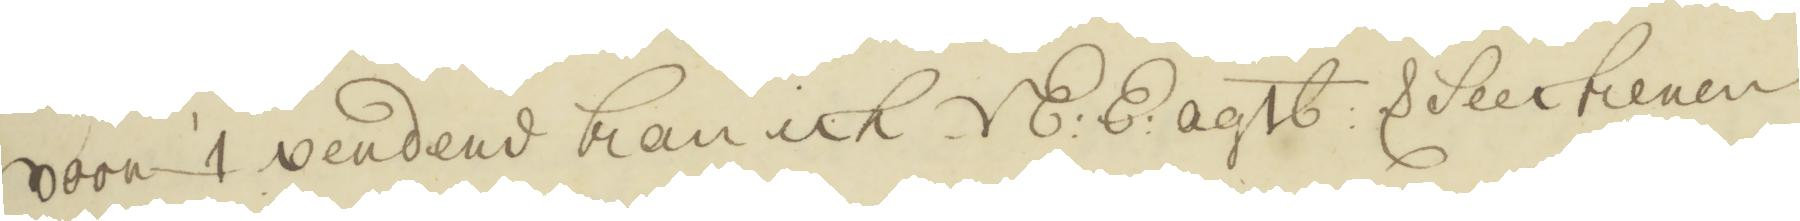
voor ’t verdere kan ick uE: E: agtb: verseeckeren
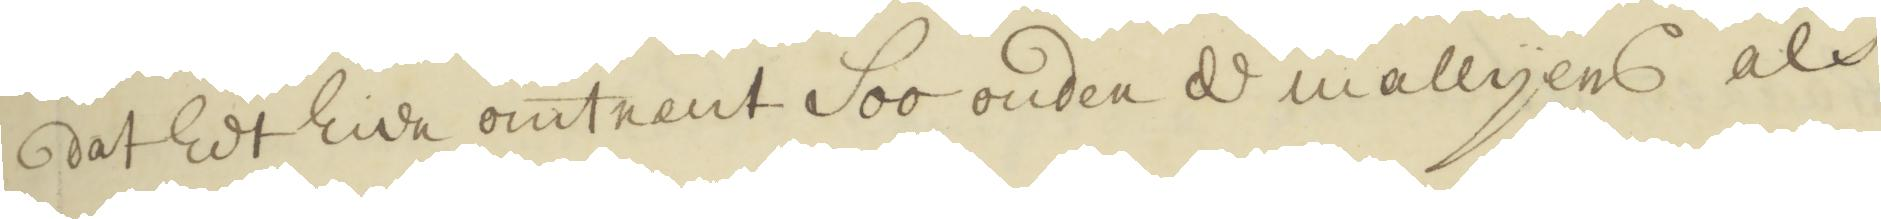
dat het hier omtrent soo onder de mallijers als
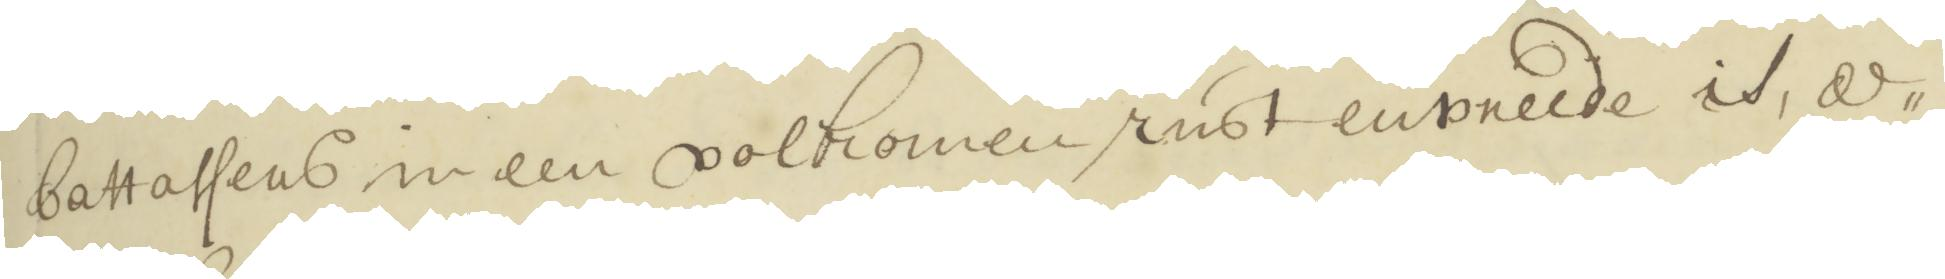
battassers in een volkomen rust en vreede is, de„
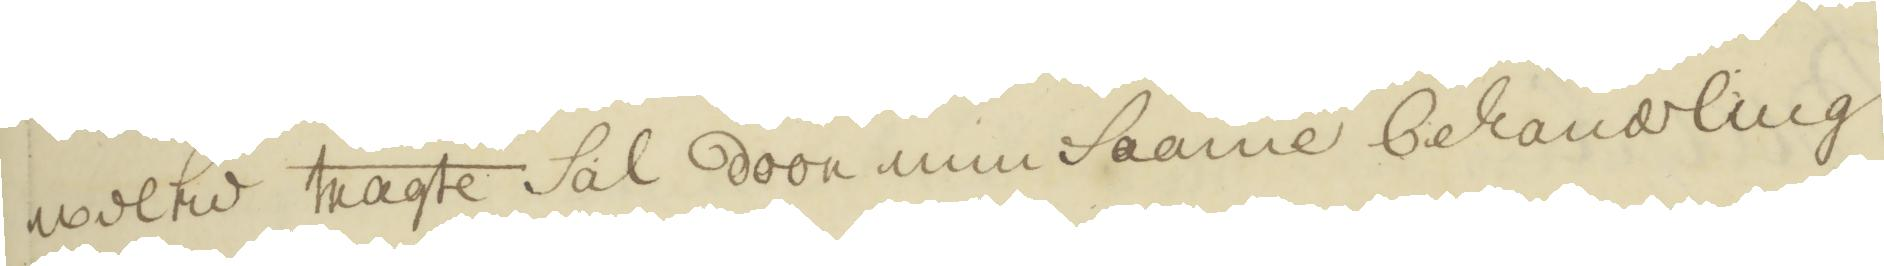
welke tragte sal door min saame behandeling
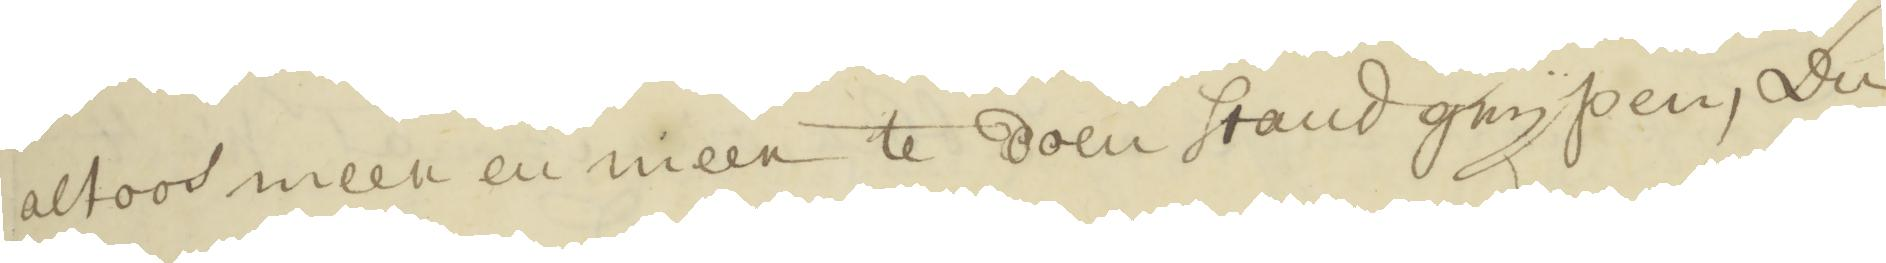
altoos meer en meer te doen stand grijpen, ten
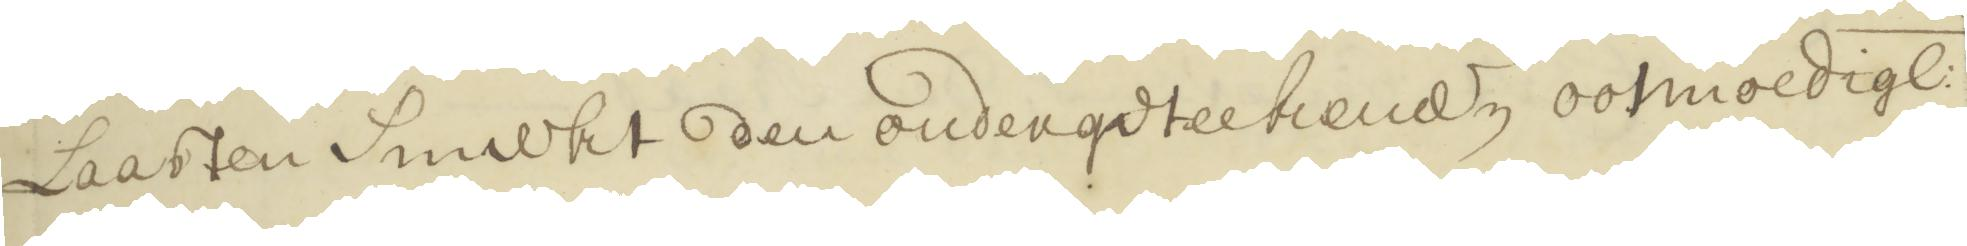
Laasten smeekt den ondergeteekenden ootmoedigl:
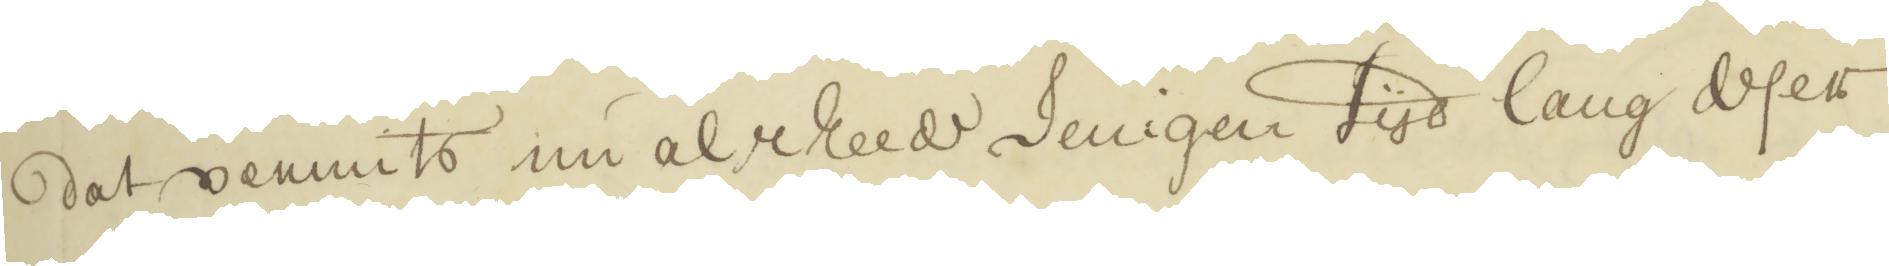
dat vermits nu al rheeds Eenigen tijd lang deser
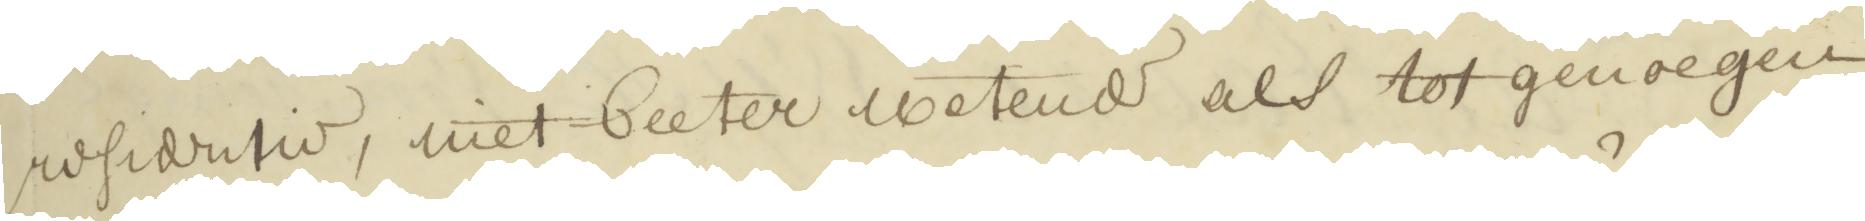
residentie, niet beeter wetende als tot genoegen
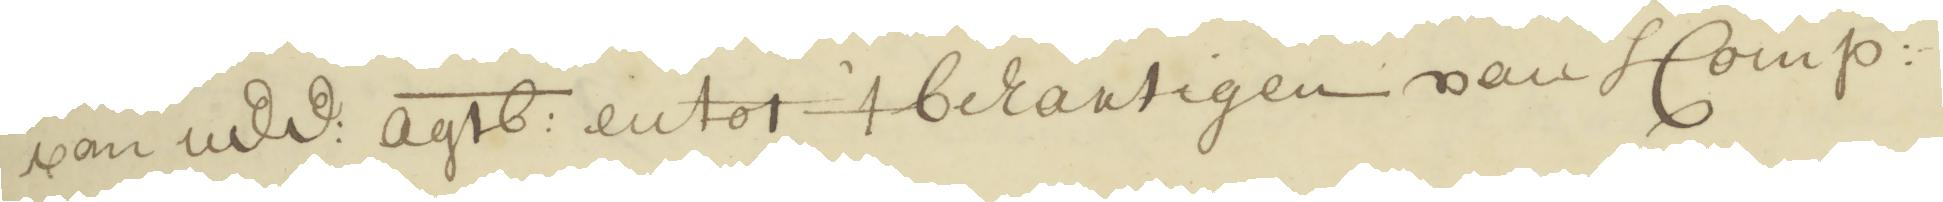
van uEE: agtb: en tot ’t behartigen van 'sComp:s
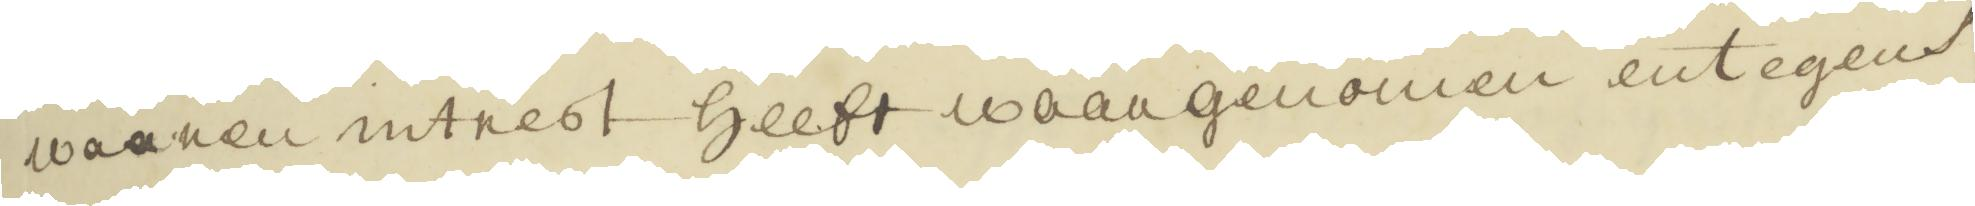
waaren intrest heeft waargenomen entegens
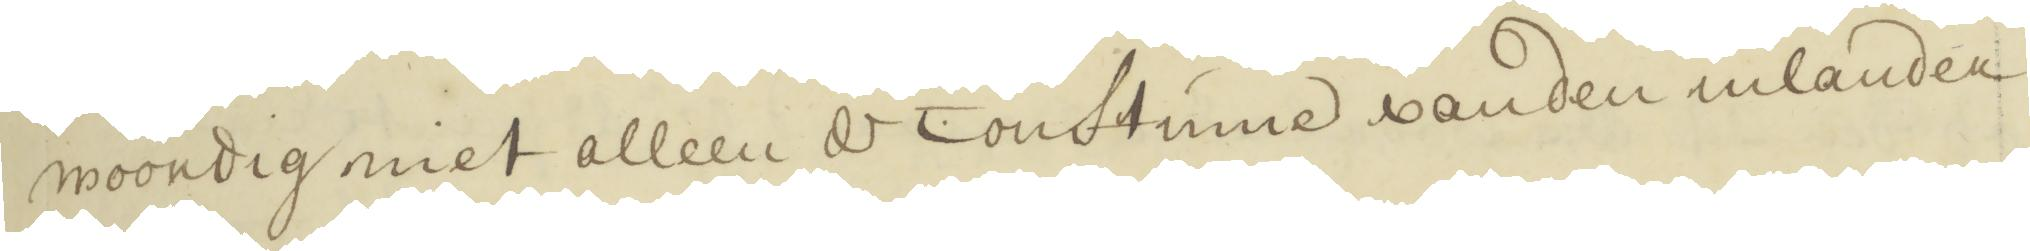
woordig niet alleen de constume van den inlander
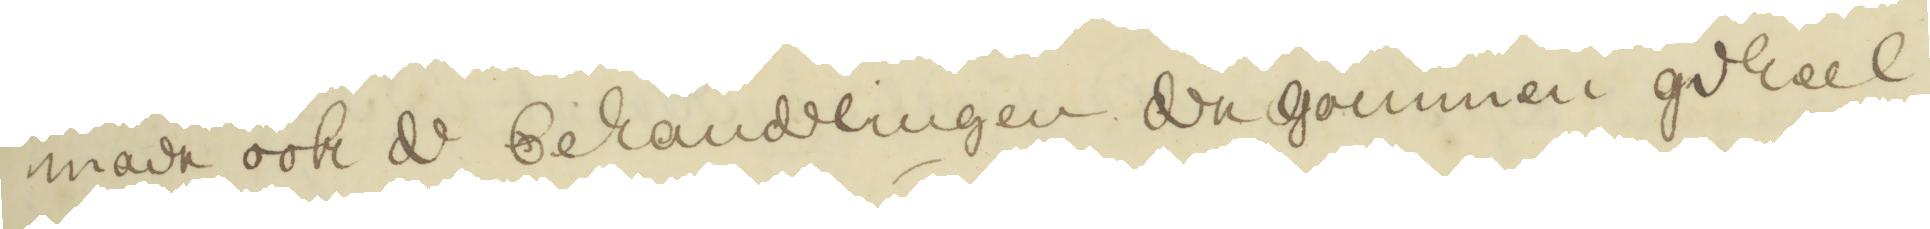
maer ook de behandelingen der gommen geheel
